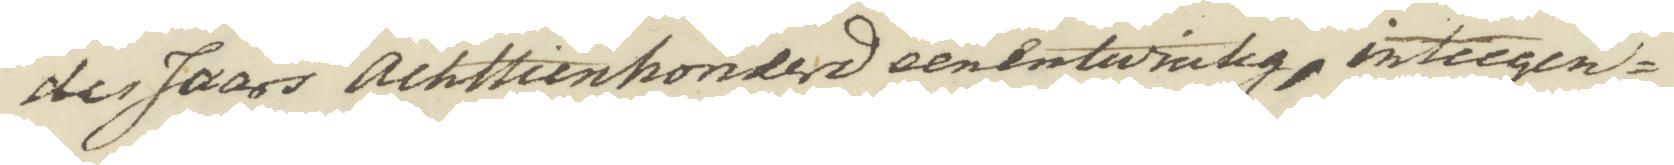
des Jaars Achttienhonderd eenentwintig, inteegen=
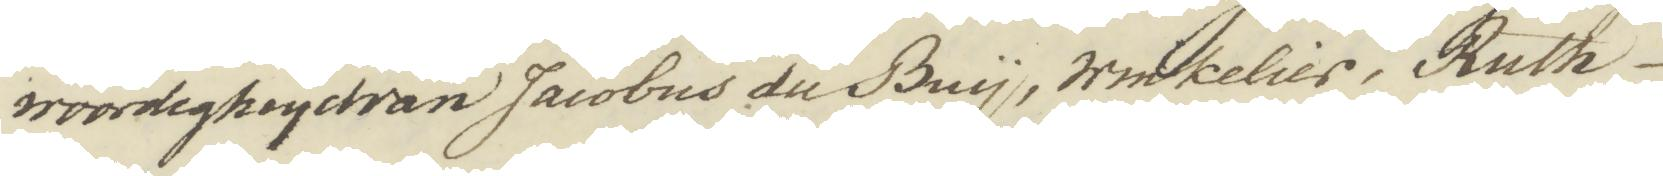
woordigheydvan Jacobus du Buij, winkelier, Ruth -
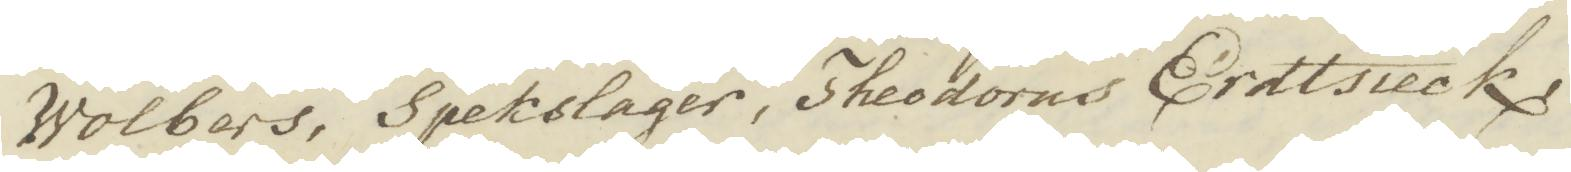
Wolbers, spekslager, Theodorus Erdtsieck,
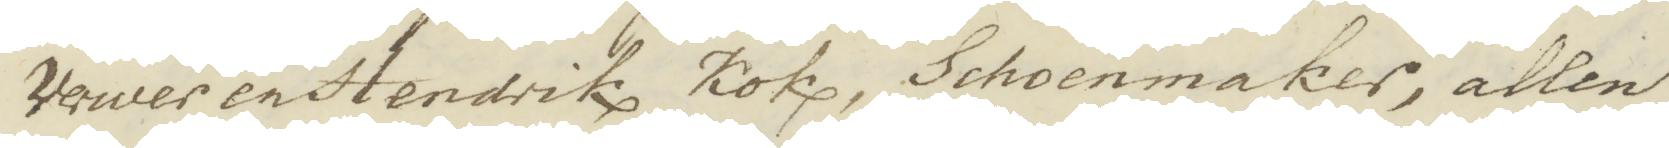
Verver en Hendrik Kok, Schoenmaker, allen
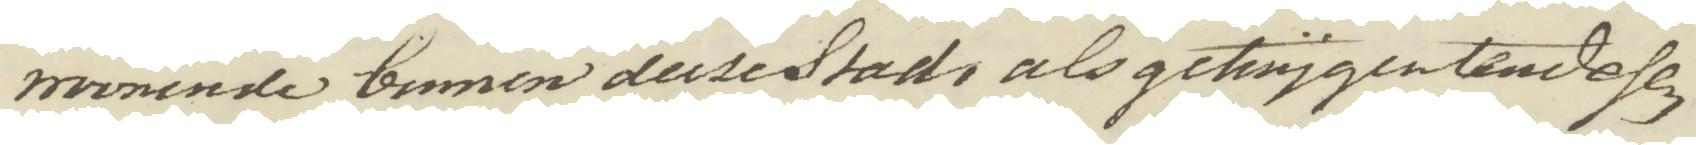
woonende binnen deeze Stad, als getuijgen tendesen
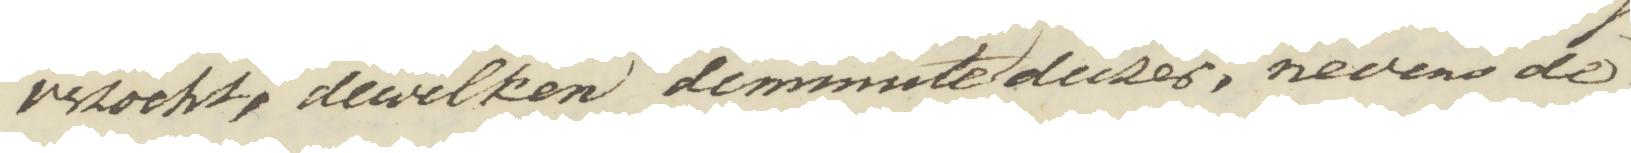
verzocht, dewelken deminute deezes, nevens de
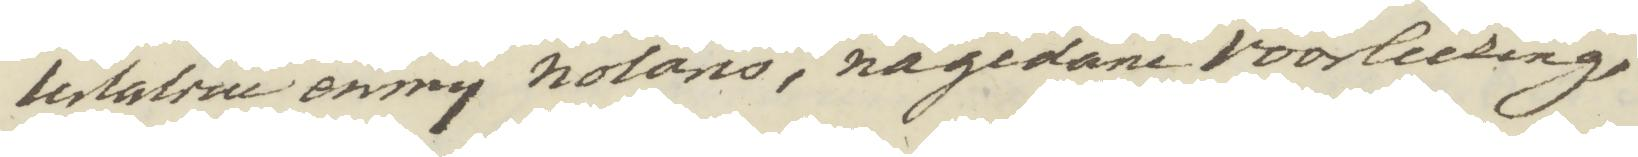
testatrice enmy notaris, nagedane voorleezing,
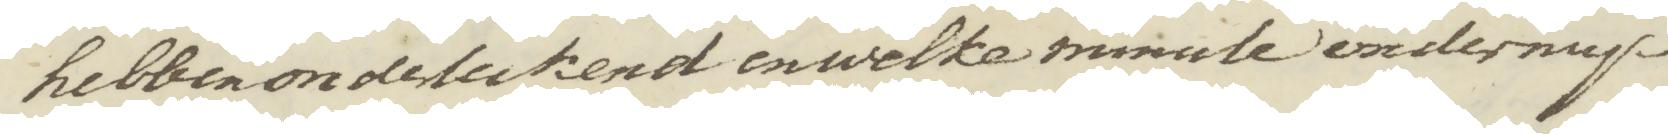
hebben onderteekend en welke minute ondermy
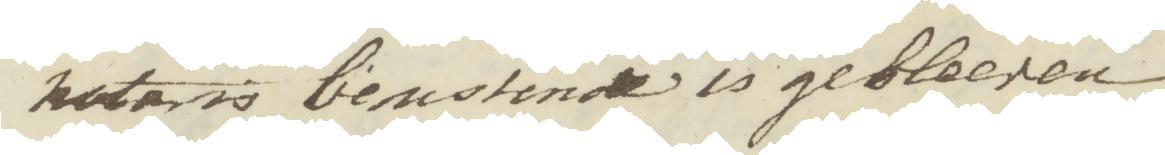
notaris berustende is gebleeven.
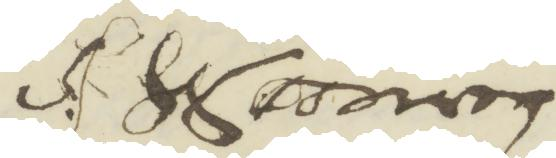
S: Kooning
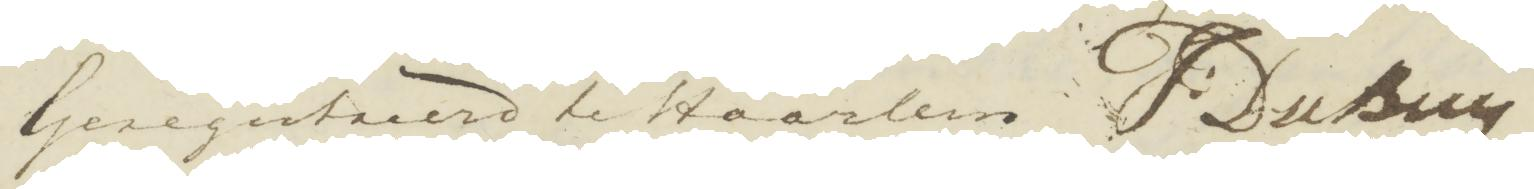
Geregistreerd te Haarlem J: Du Buy
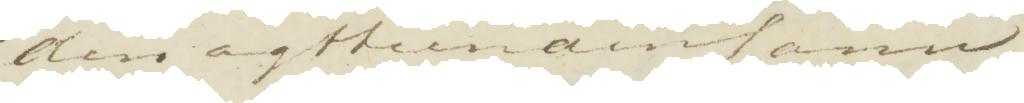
den agttiendenJanu
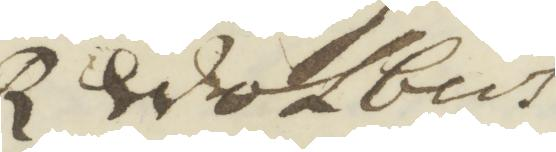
R Wolbers
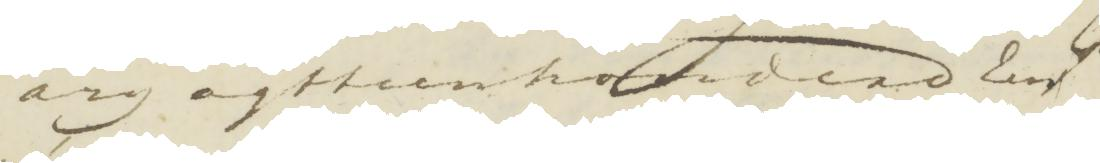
ary agttienhonderd Een
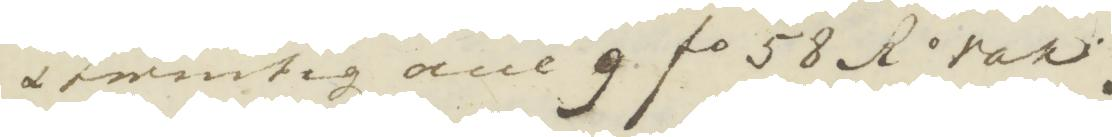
& twintig deel 9. fo 58 Ro vak
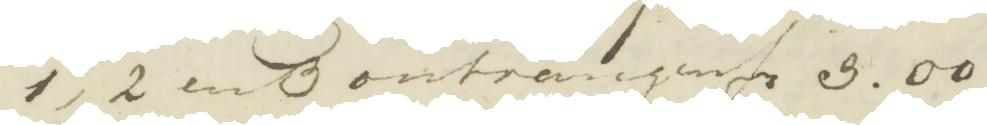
1, 2 en 3 ontvangen fr 3. 00
